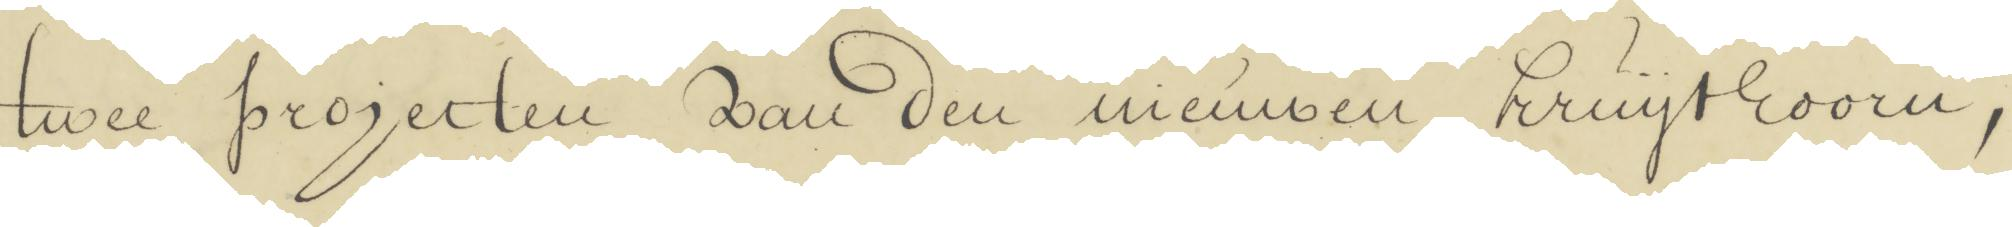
twee projecten van den nieuwen kruijthoorn,
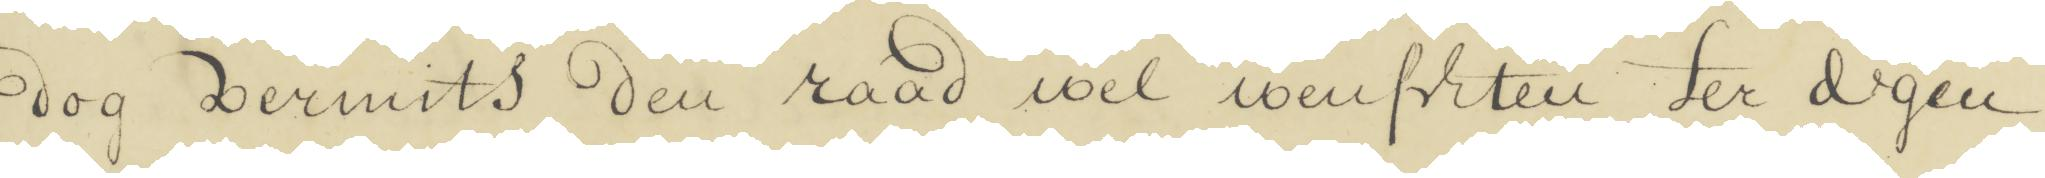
dog vermits den raad wel wenschten ter degen
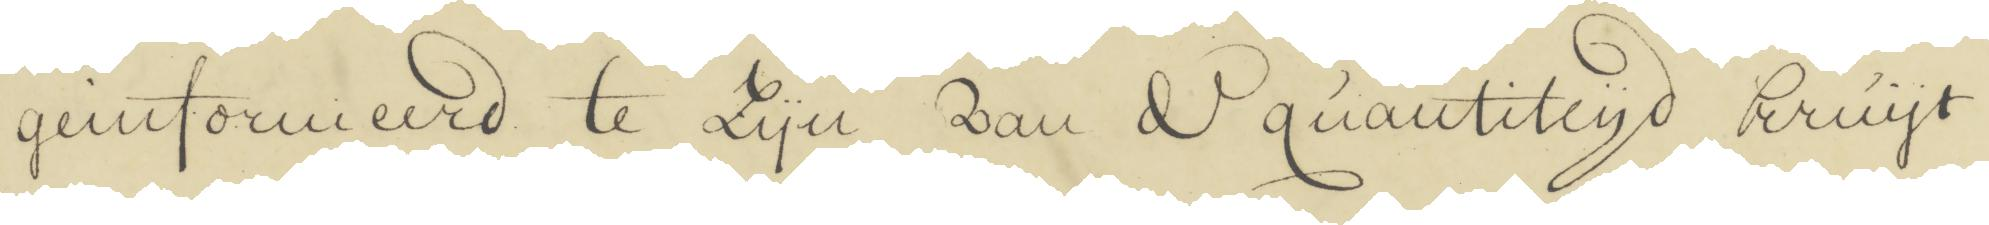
geinformeerd te zijn van de quantiteijd kruijt
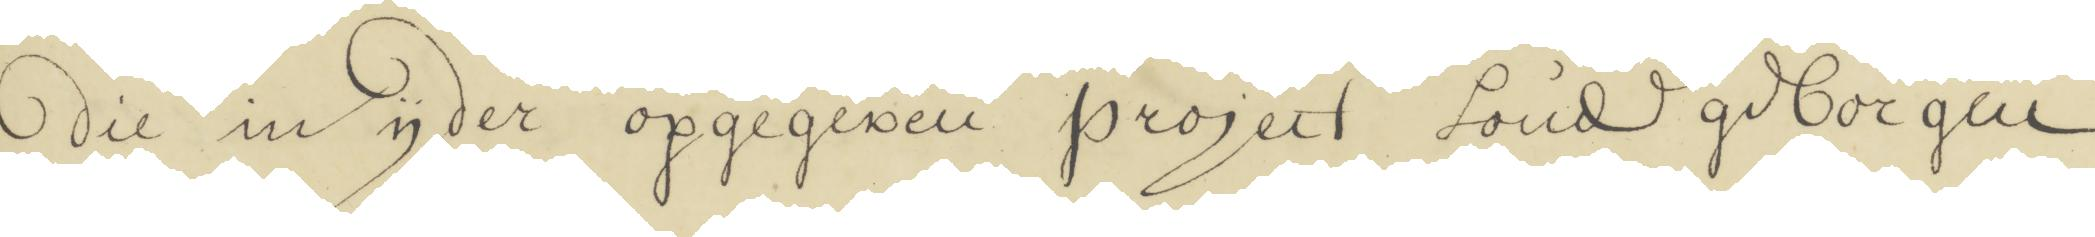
die in ijder opgegeven project soude geborgen
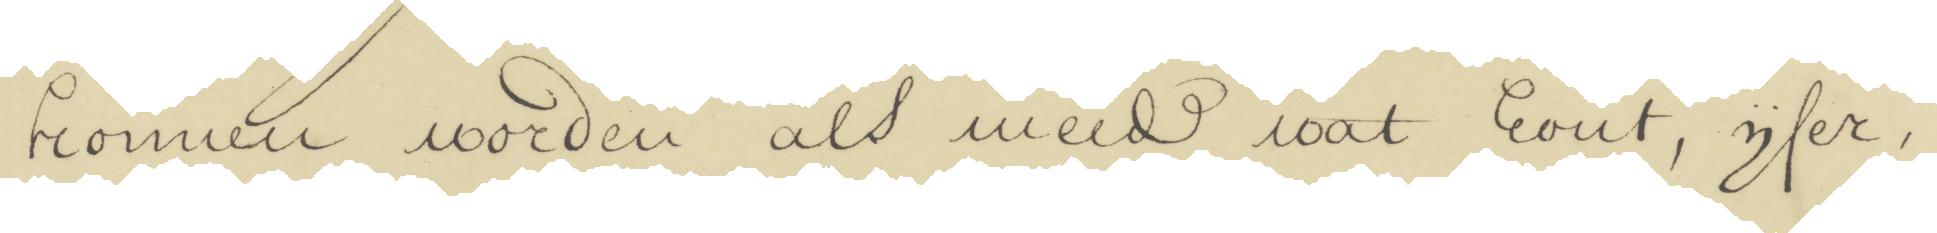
konnen worden als meede wat hout, ijser,
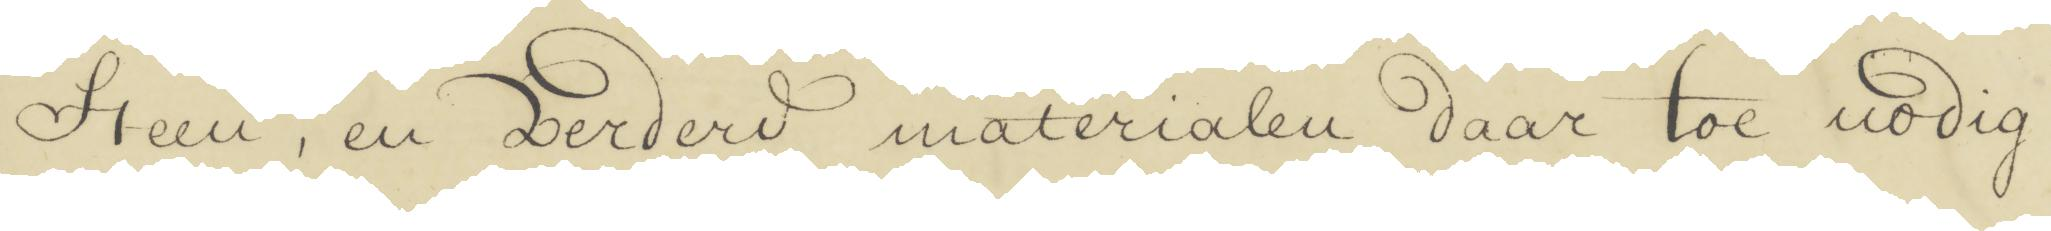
steen, en verdere materialen daar toe nodig
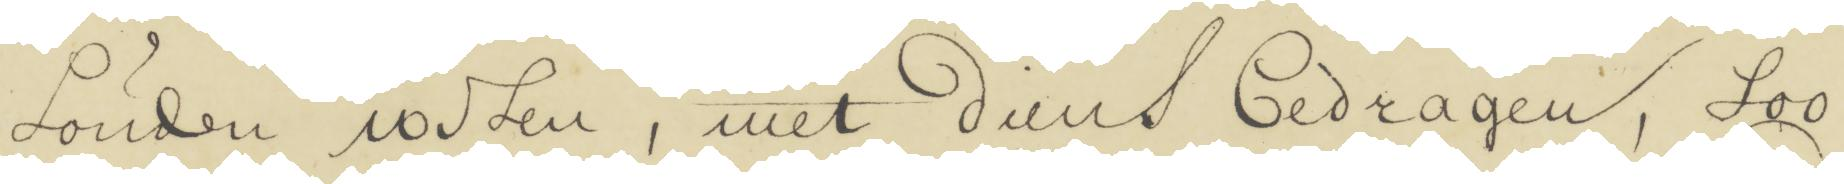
souden wesen, met diens bedragen, soo
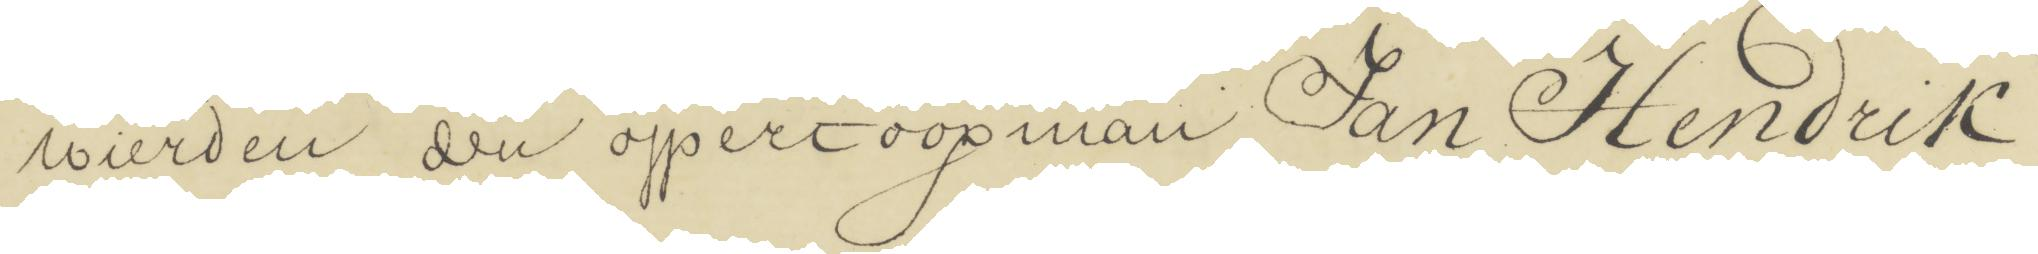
wierden den oppercoopman Ian Hendrik
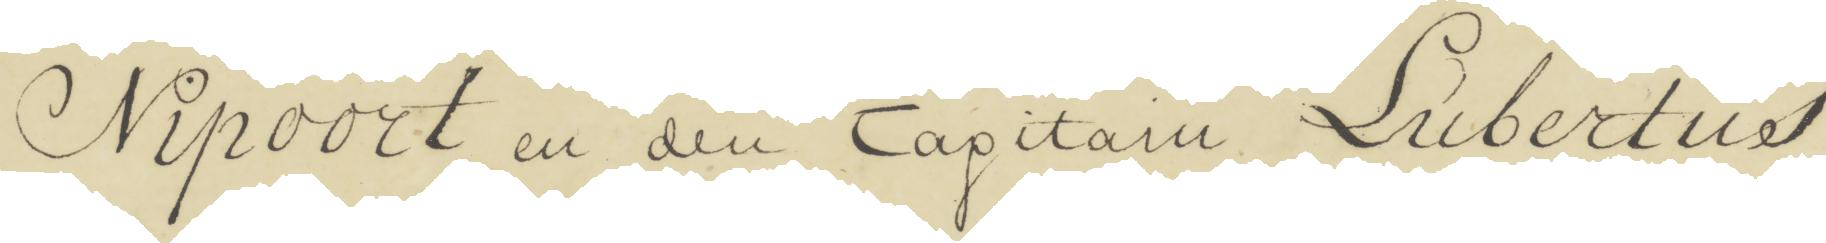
Nipoort en den Capitain Lubertus
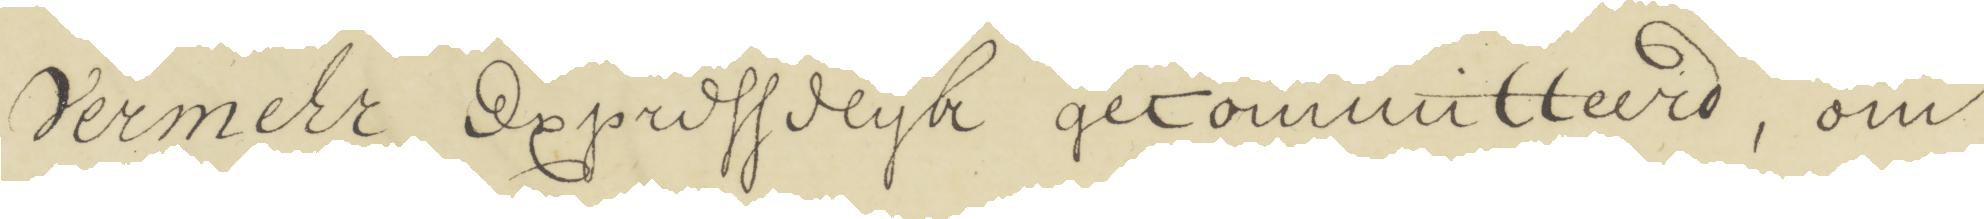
Vermehr Expresselijk gecommitteerd, om
